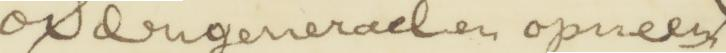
over den generaelen opneem
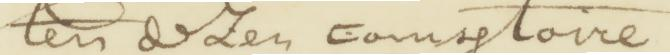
ten dezen comptoire
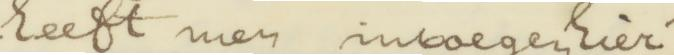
heeft men invoegen hier
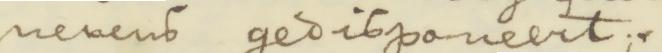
nevens gedisponeert;-
